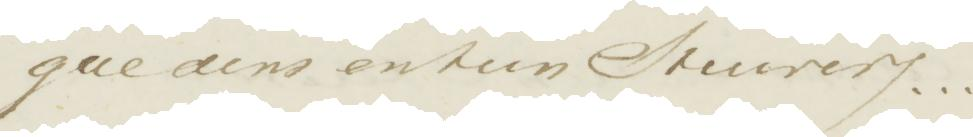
guldens en tien Stuivers - - - - - „
